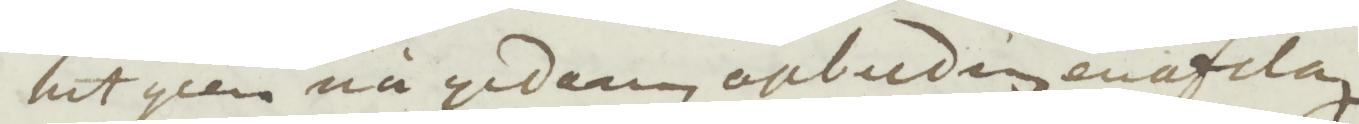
het geen na gedane opbieding en afslag
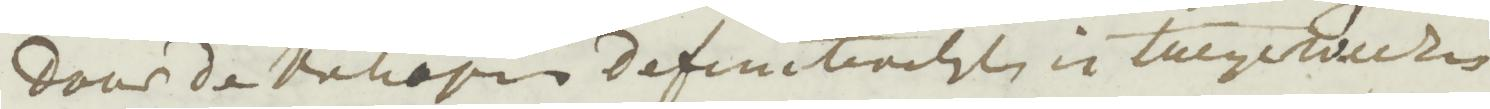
door de verkoper definitivelyk is toegeweezen
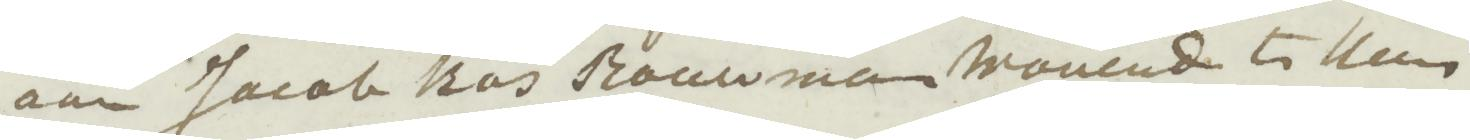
aan Jacob Kas Bouwman wonende te Heems
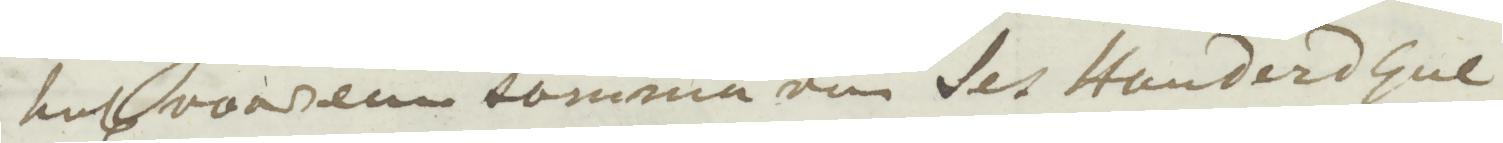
kerk voor den somma van ses Honderd Gul
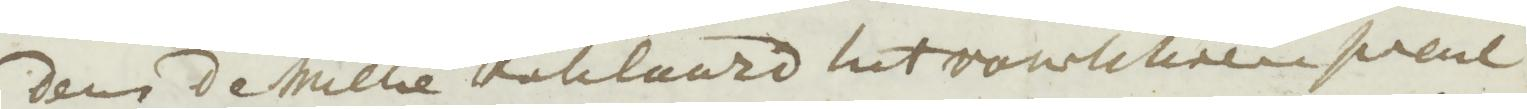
dens de welke verklaard het voorschreven preel
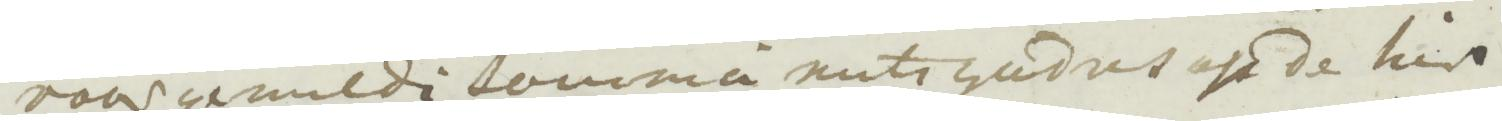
voor gemelde somma mits gaders op de hier
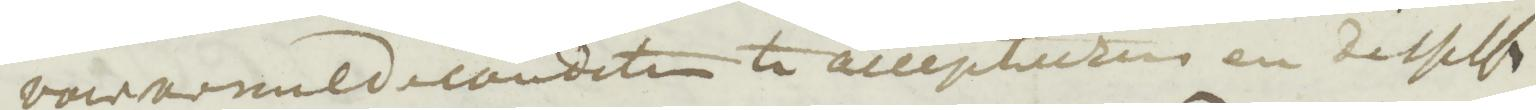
voor vermelde conditien te accepteeren en desselfs
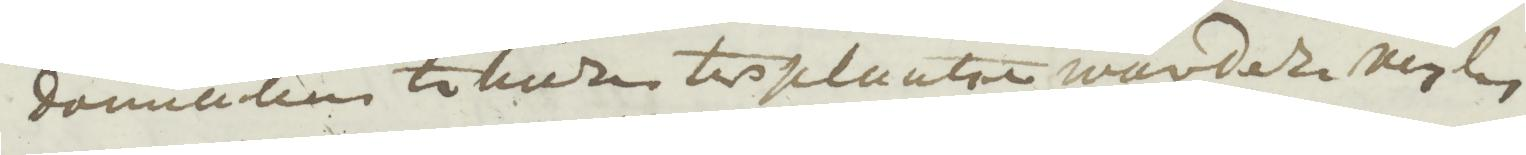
domicilien te kiezen ter plaatse waar deze veyling
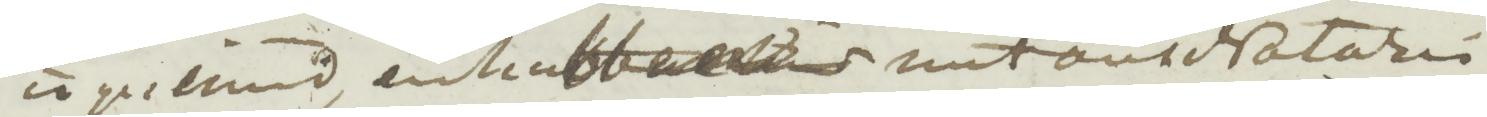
is geind, en hebbende met ons Notaris
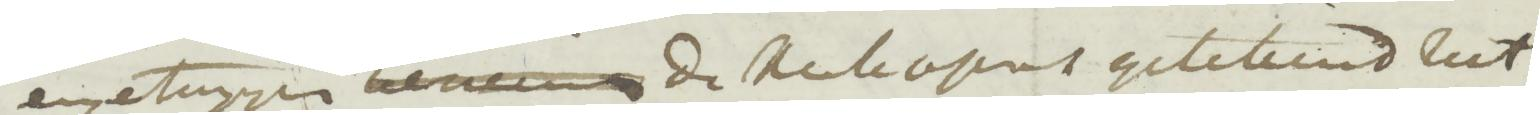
en getuygen krachtens de verkopers getekend uit
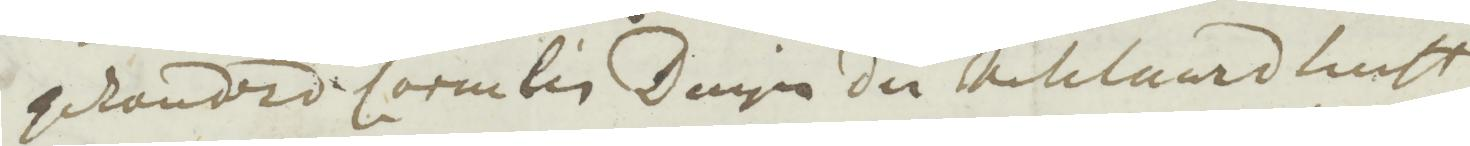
gezonderd Cornelis Duyn die verklaard heeft
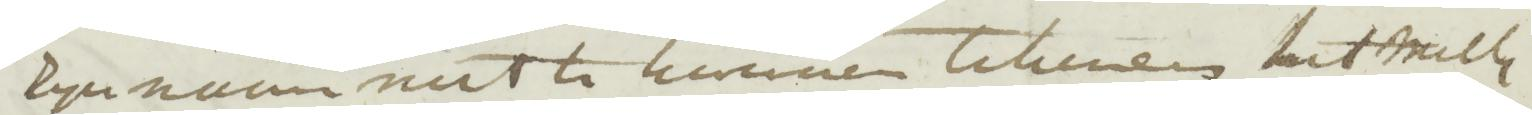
zyn naam niet te kunnen tekenen het welk
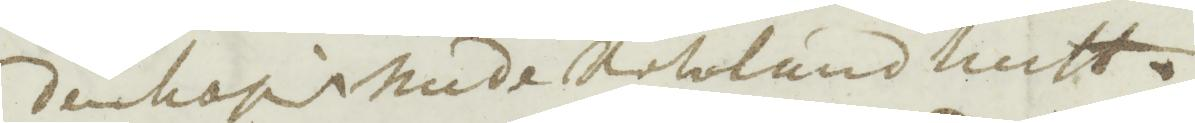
den koper meede votoland heeft.
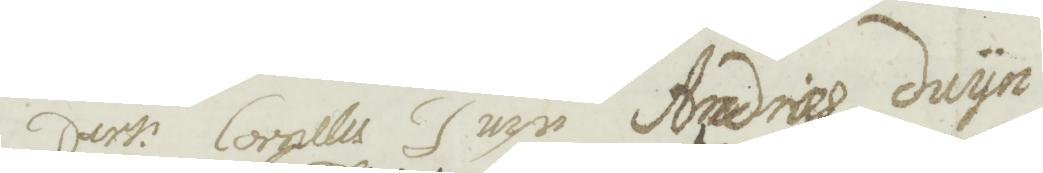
Ders Cornelis Duijn Andries duijn
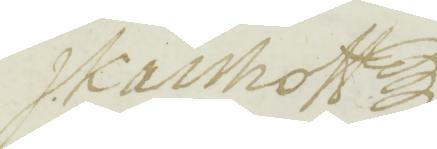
J.Karnhoff
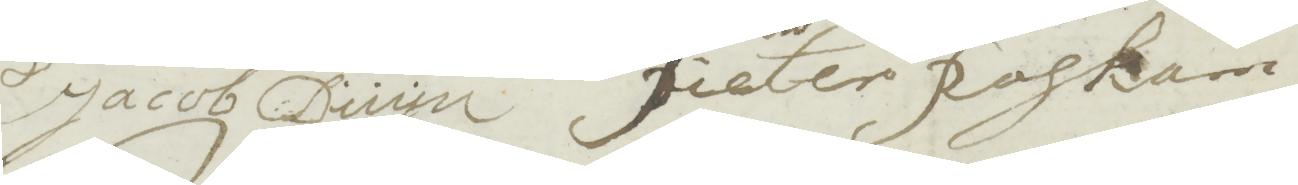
Jacob Duijn Pieter Roskam
